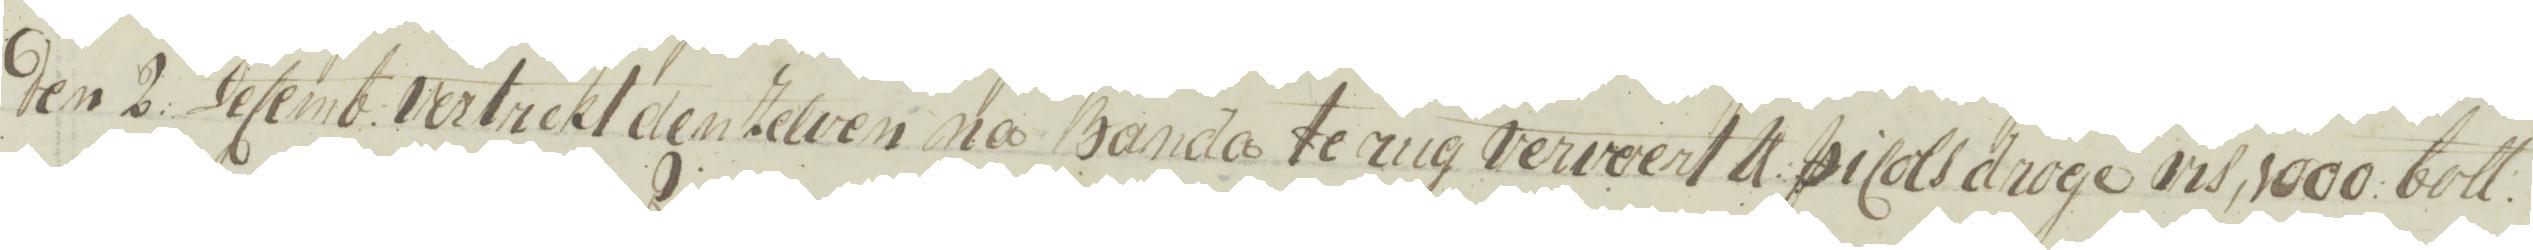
den 2. Decemb: vertreckt den zelven na Banda te rug vervoert 4: picols droge vis, 1000: bolt:
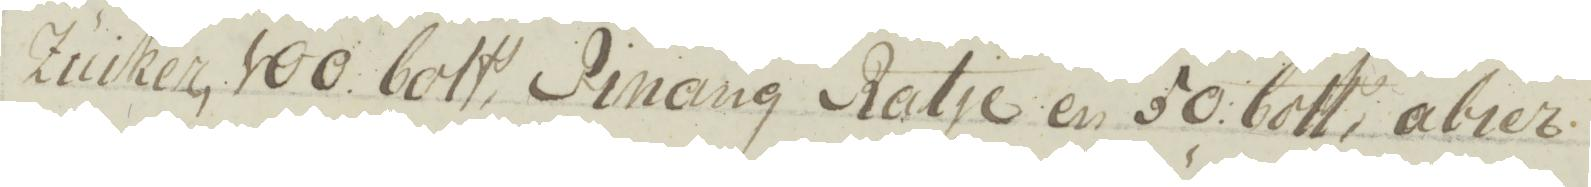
Zuiker, 100: bolt„s Pinang Ratje en 50: bolt„s abier
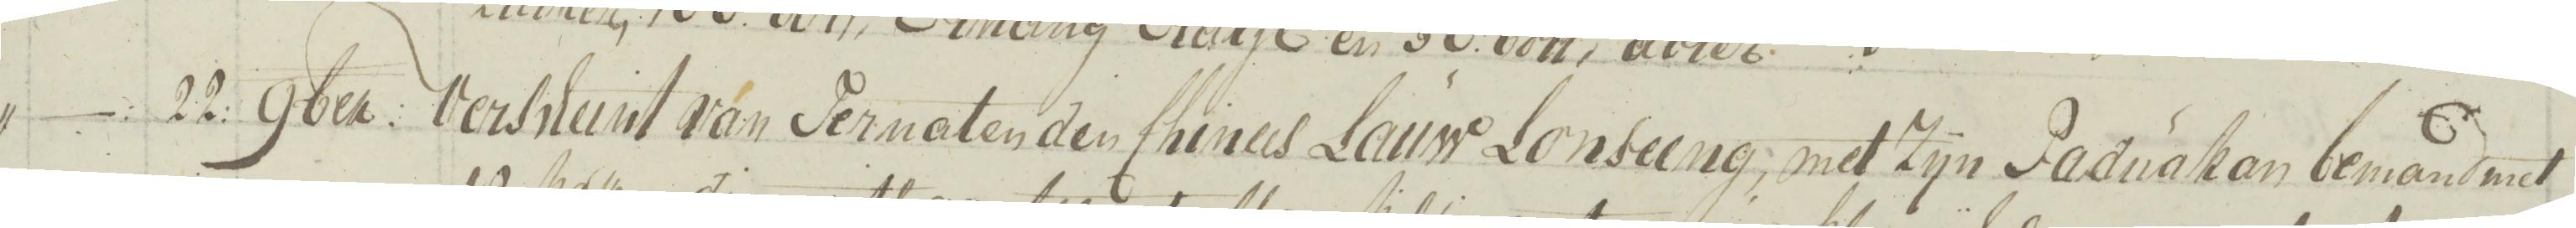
„ — : 22: 9ber: verscheint van Ternaten den Chinees Lauw Lonseeng, met zijn Paduakan bemand met
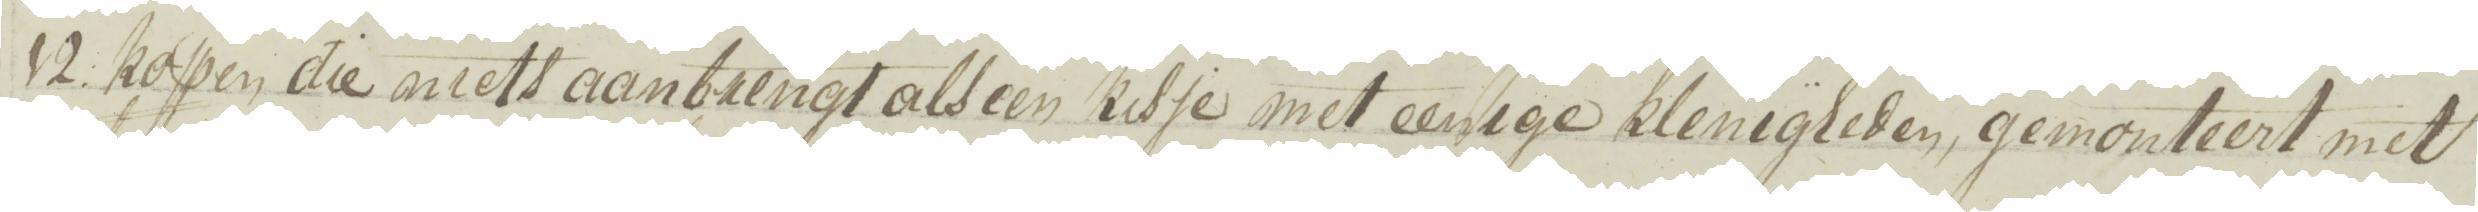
12: koppen die niets aanbrengt als een kisje met eenige klenigheden, gemonteert met
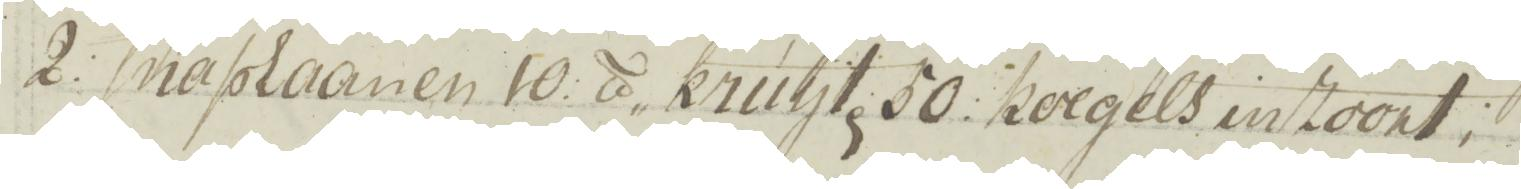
2: snaphaanen 10: lb„ kruijt en 50: koegels inzoort;
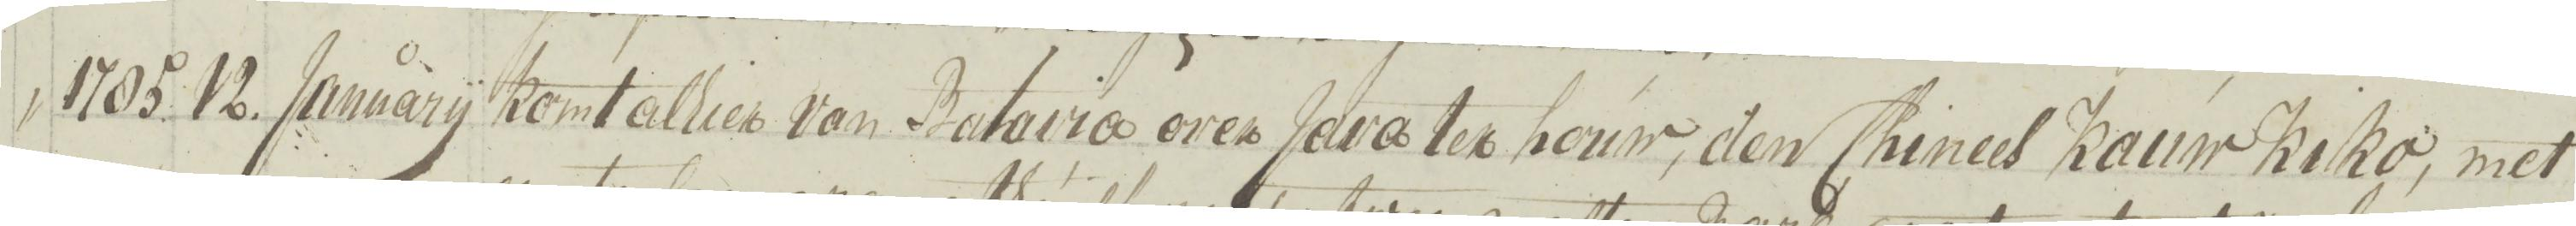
„ 1785: 12. Januarij komt alhier van Batavia over Java ter houw, den Chinees Kauw Kiko, met
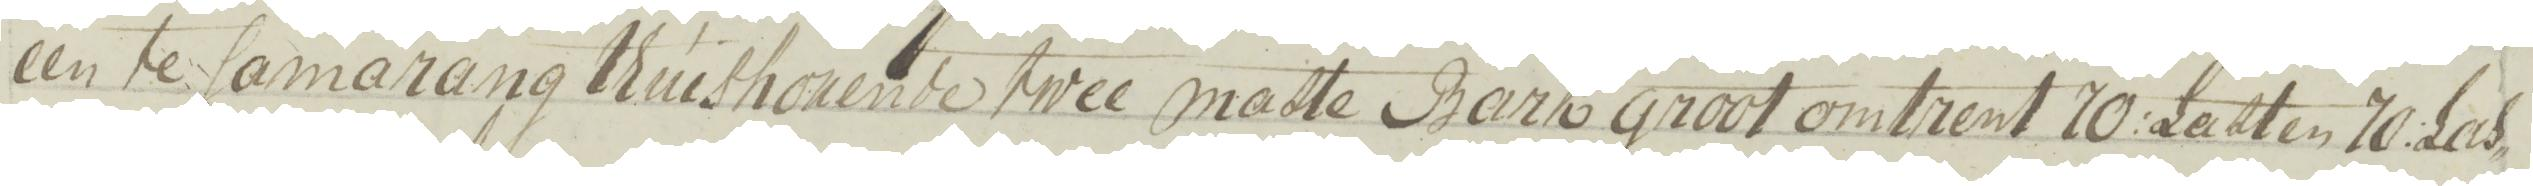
een te samarang thuis horende twee maste Bark groot omtrent 70: Lasten 70: Las„
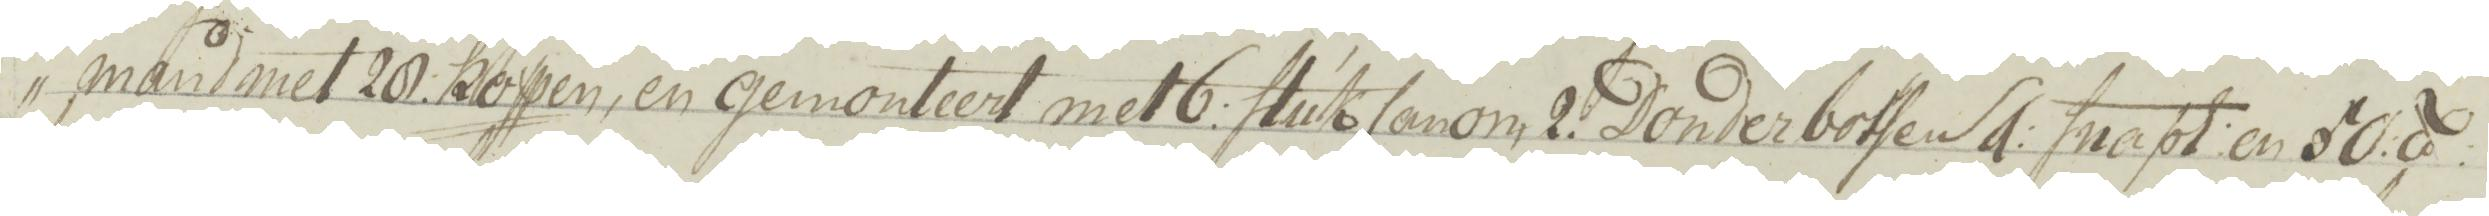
„mand met 28: koppen, en gemonteert met 6: stuk Canon, 2: Donderbossen 4: snaph: en 50:lb.
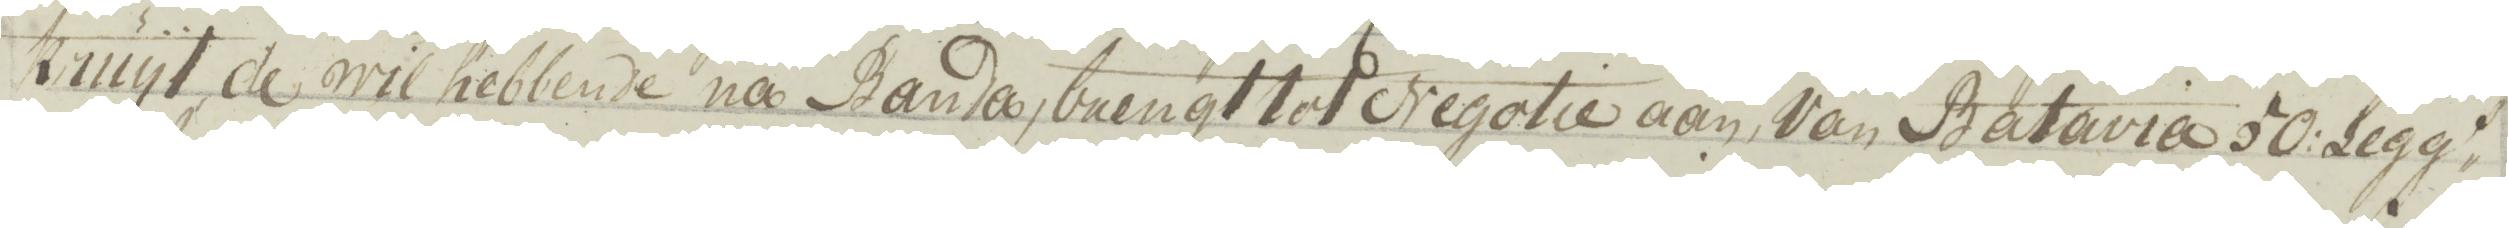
kruijt, de wil hebbende na Banda, brengt tot Negotie aan, van Batavia 50: Legg„s
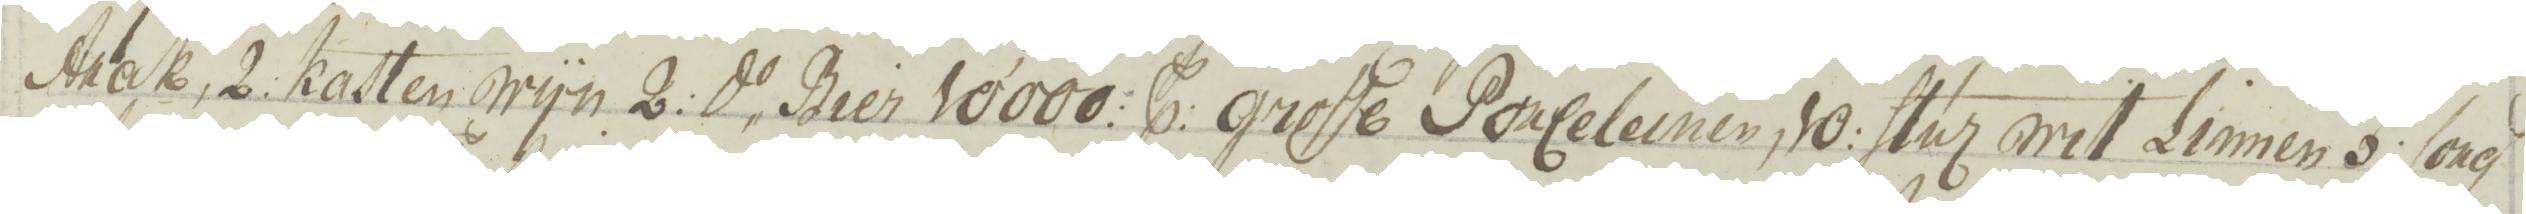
Arak, 2. kasten wijn 2: d„o Bier 10000: p:s groffe Porceleinen, 10: stux wet Linnen 5: corg
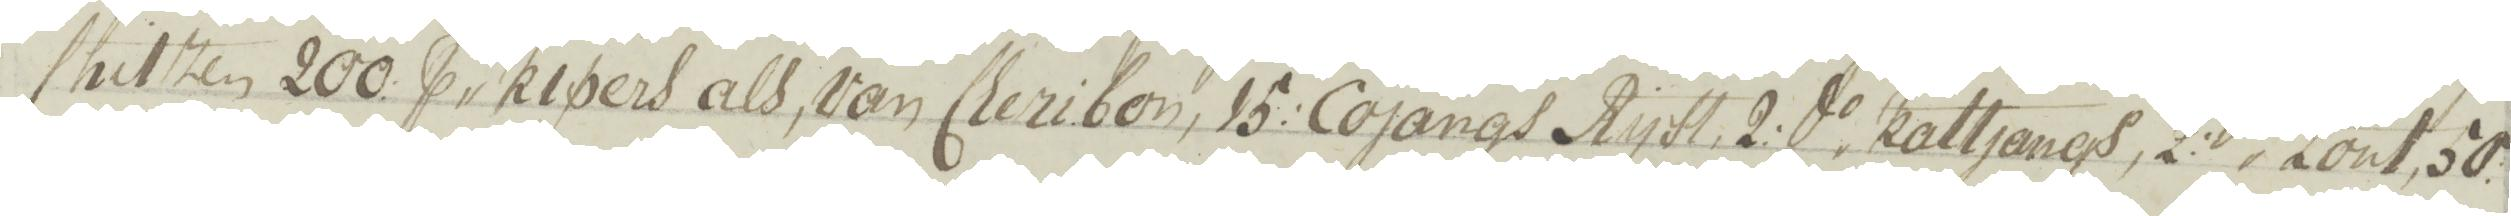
Chitzen 200: p„s kipers als, van Cheribon, 15: Cojangs Rijst, 2: d„o kattjangs, 2: d„o Zout, 50
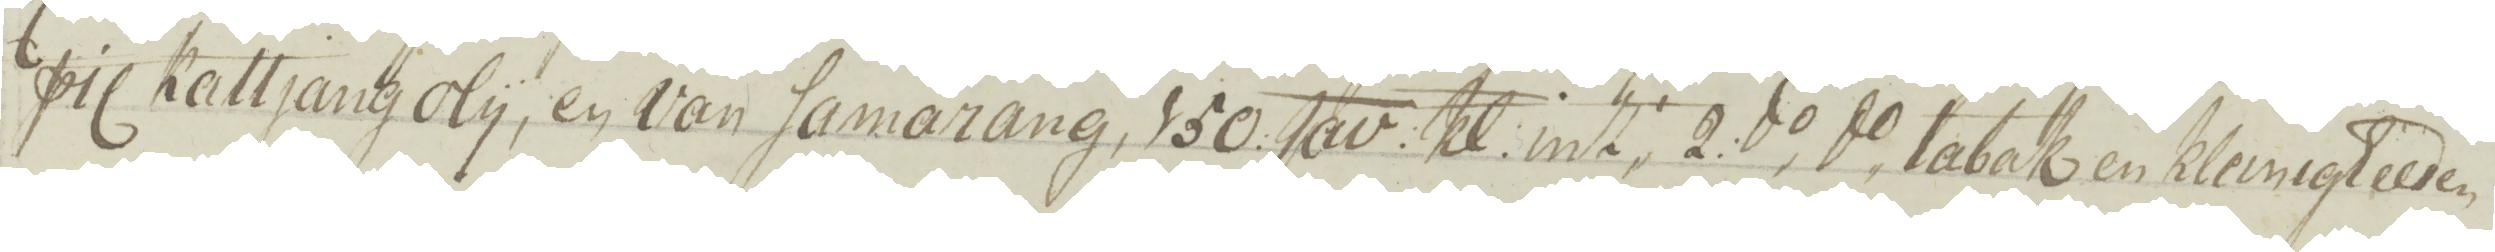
pic kattjang olij, en van samarang, 150: Jav: kl: inz„t 2: d„o d„o tabak en kleinigheeden
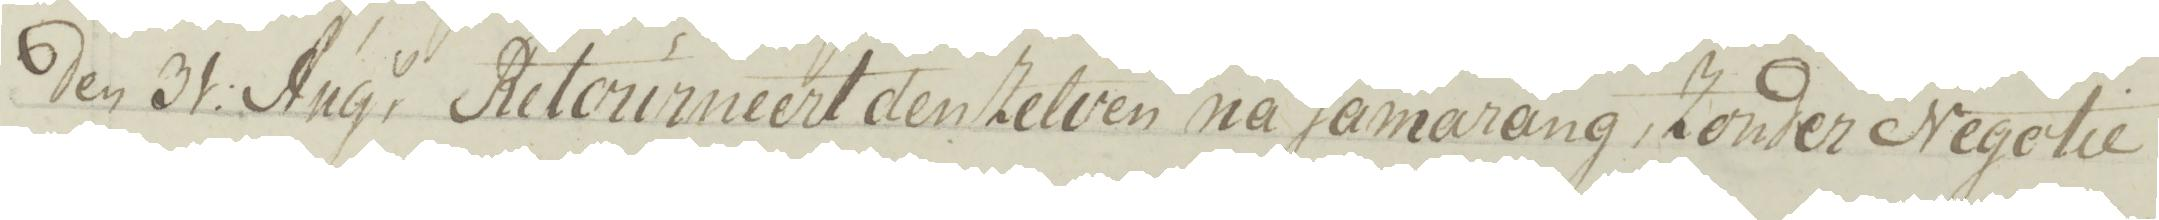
den 31: Aug„s Retourneert den zelven na samarang, zonder Negotie
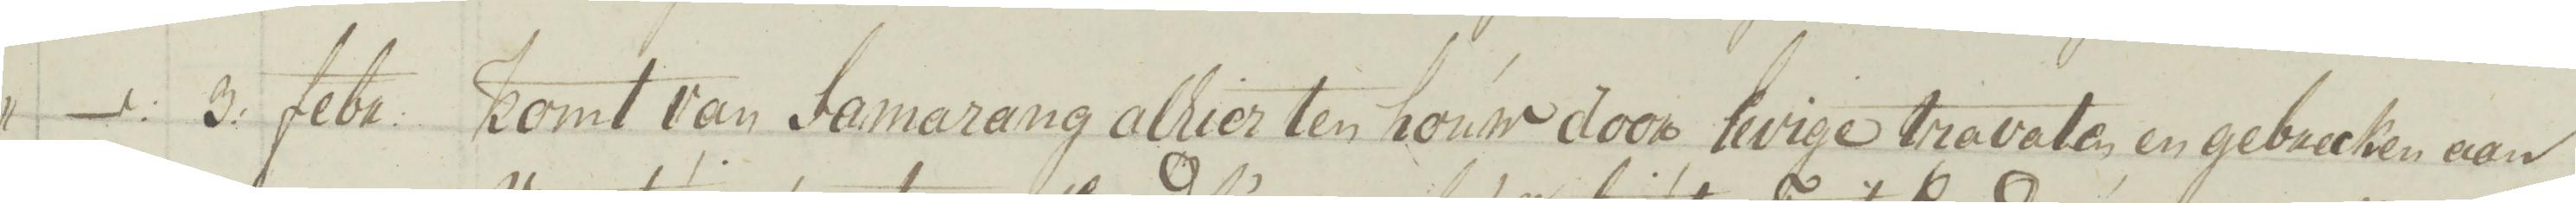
„ —: 3: febr: komt van Samarang alhier ten houw door hevige travaten en gebrecken aan
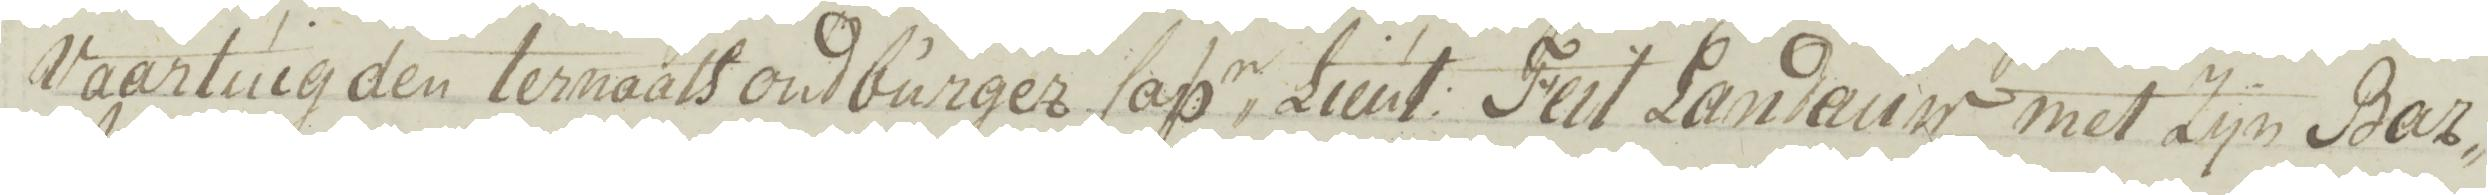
vaartuig den termaats oudb urger Cap„n Lieut: Feit Landauw met zijn Bar„
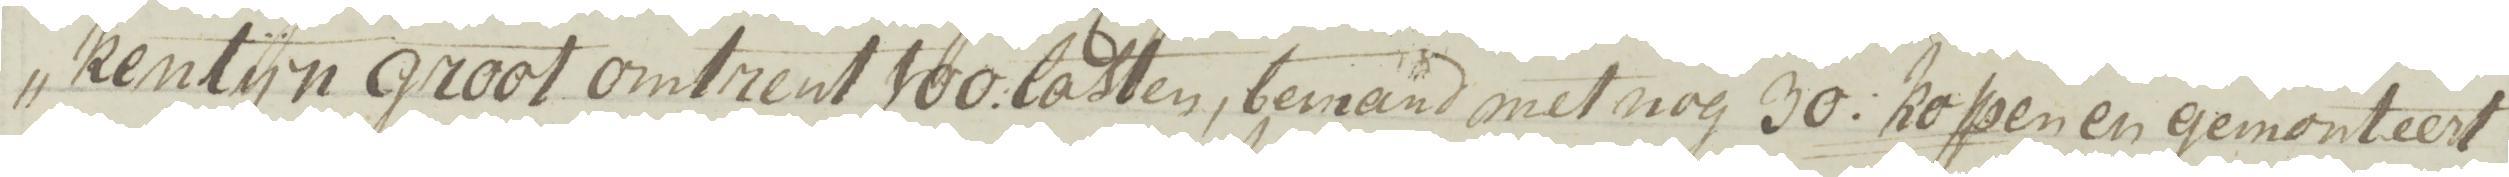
„kentijn groot omtrent 100: lasten, bemand met nog 30: kopen en gemonteert
